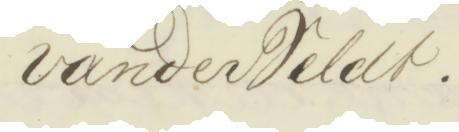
van der Veldt.
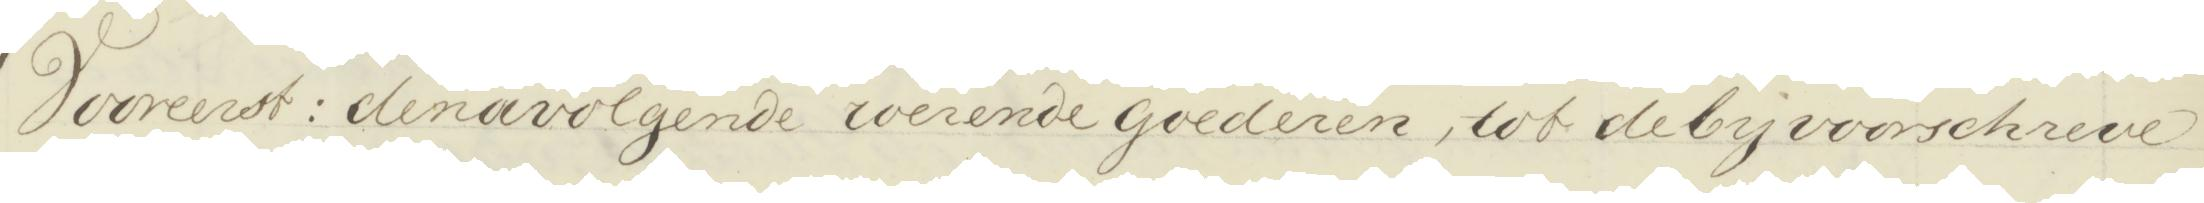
Vooreerst: de navolgende roerende goederen, tot de by voorschreve
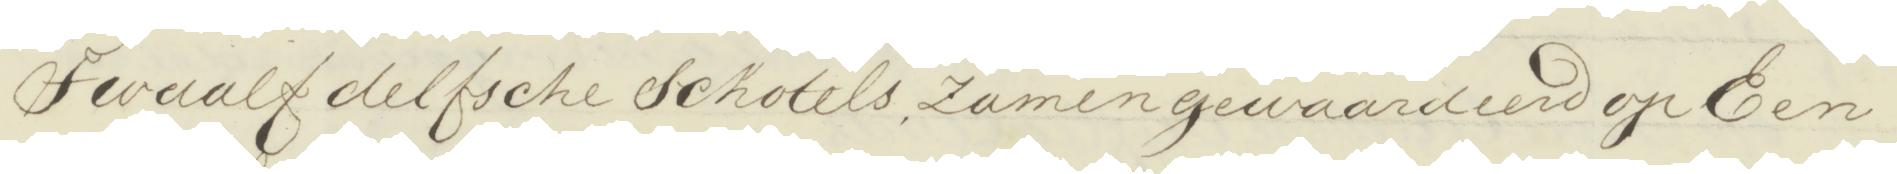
Twaalf delfsche Schotels, zamen gewaardeerd op Een
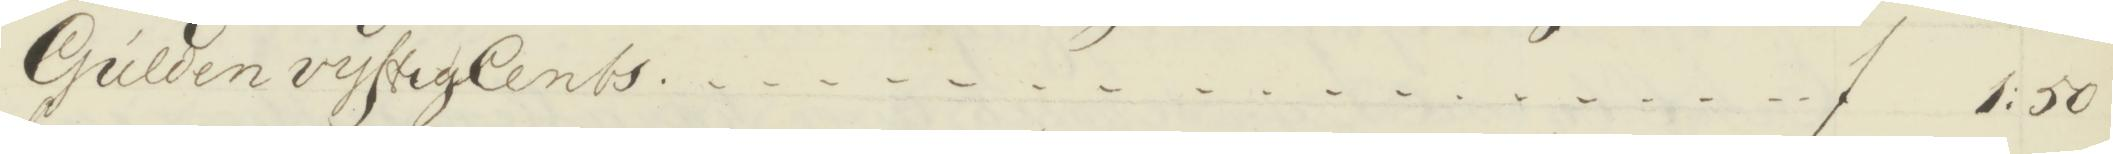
Gulden vyftig Cents. . . . . . . . . . . . . . . . . . . . . ƒ 1:50
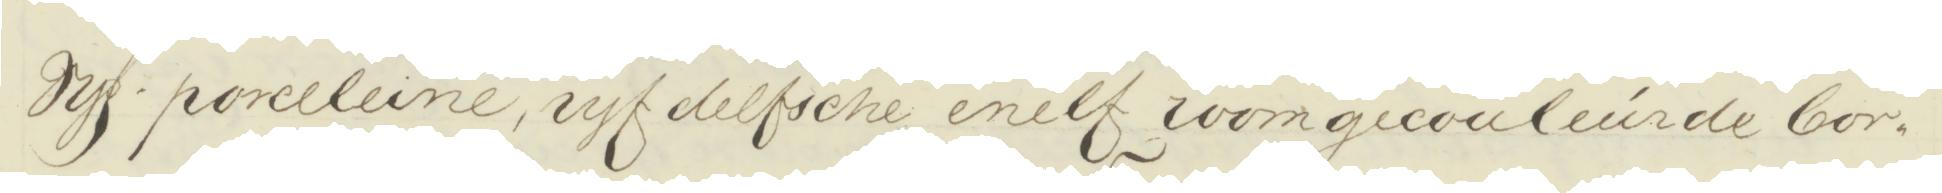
Vyf porceleine, vyf delfsche en elf roomgecouleurde bor„
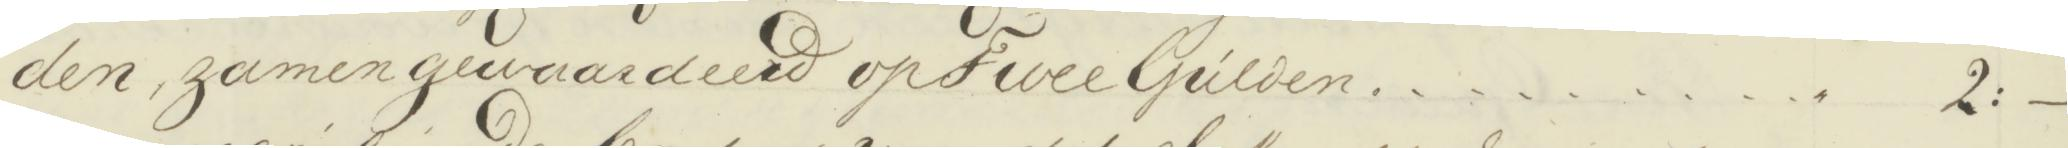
den, zamen gewaardeerd op Twee Gulden. . . . . . . . . . „ 2: —
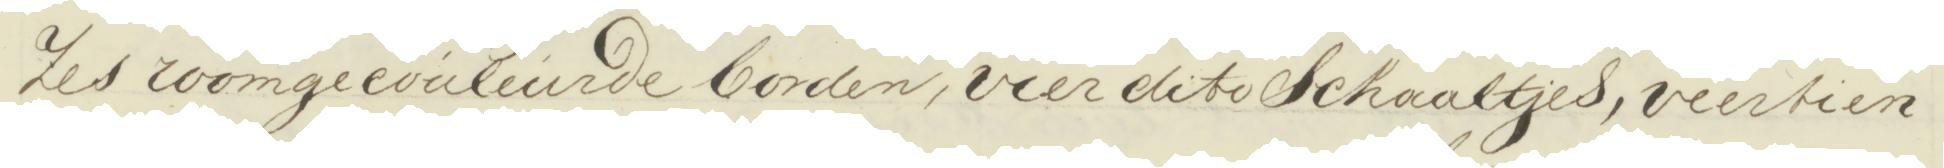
Zes roomgecouleurde borden, vier dito Schaaltjes, veertien
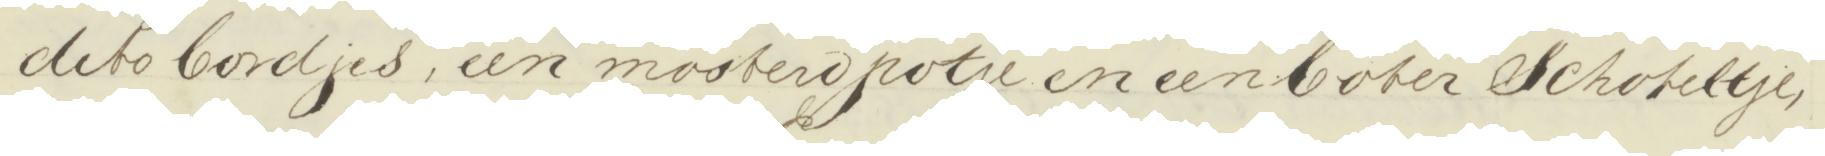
dito bordjes, een mosterdpotje en een boter Schoteltje,
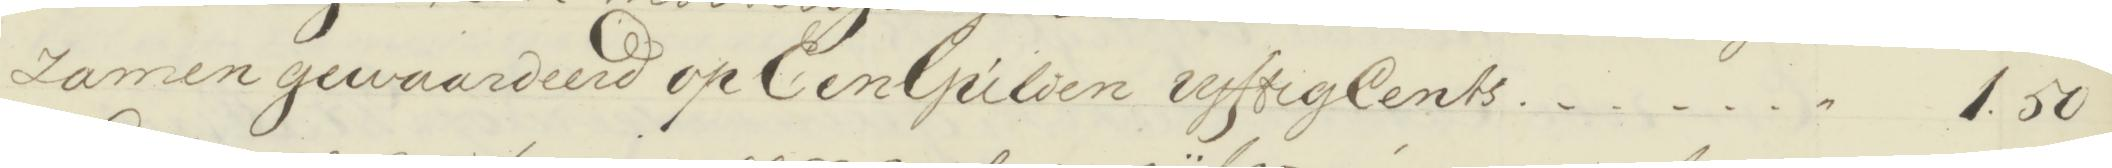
zamen gewaardeerd op Een Gulden vyftig Cents. . . . . . . „ 1.50
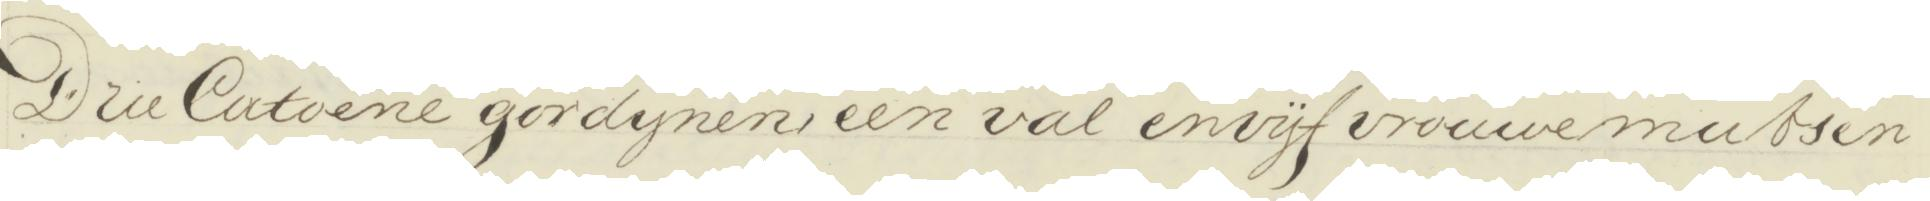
Drie Catoene gordynen, een val en vijf vrouwe mutsen
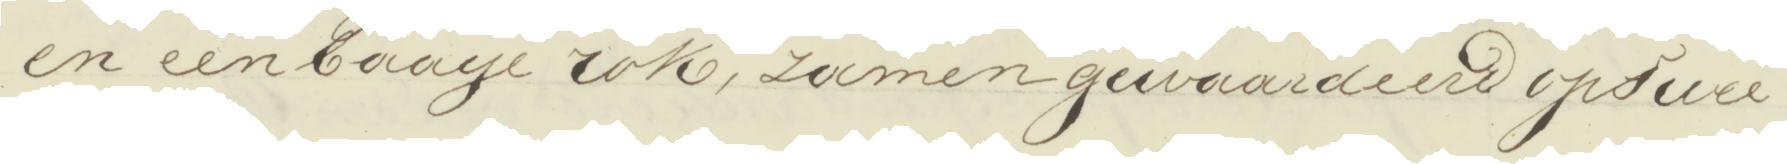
en een baaye rok, zamen gewaardeerd op Twee
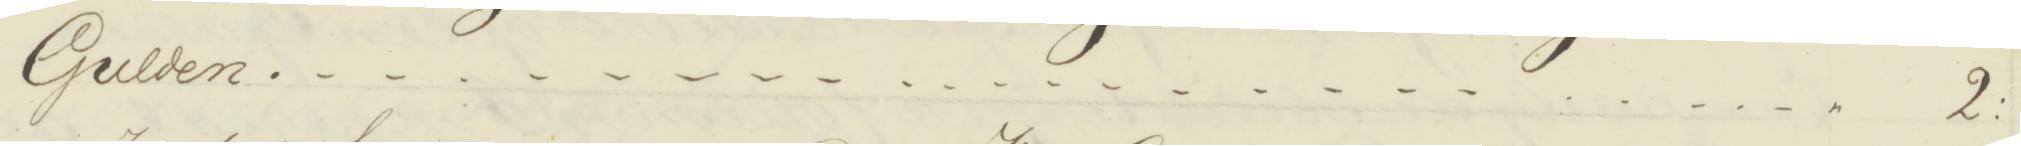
Gulden. . . . . . . . . . . . . . . . . . . . . . . . „ 2:
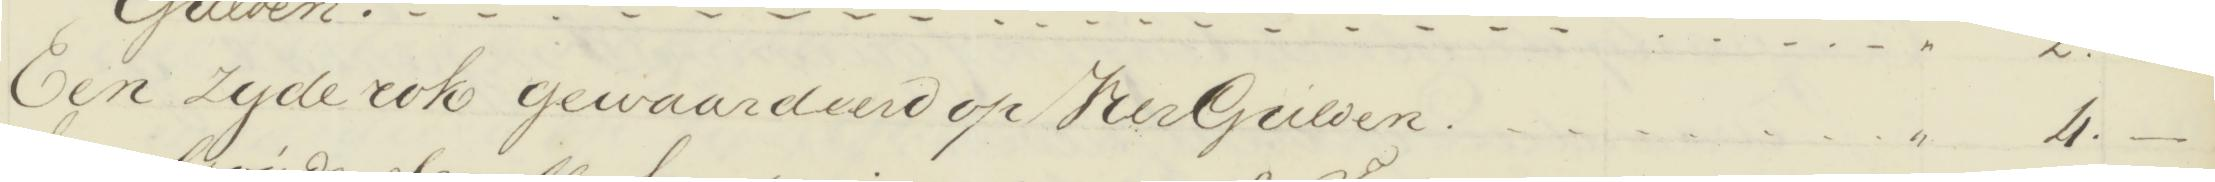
Een zyde rok gewaardeerd op Vier Gulden. . . . . . . . . . „ 4. -
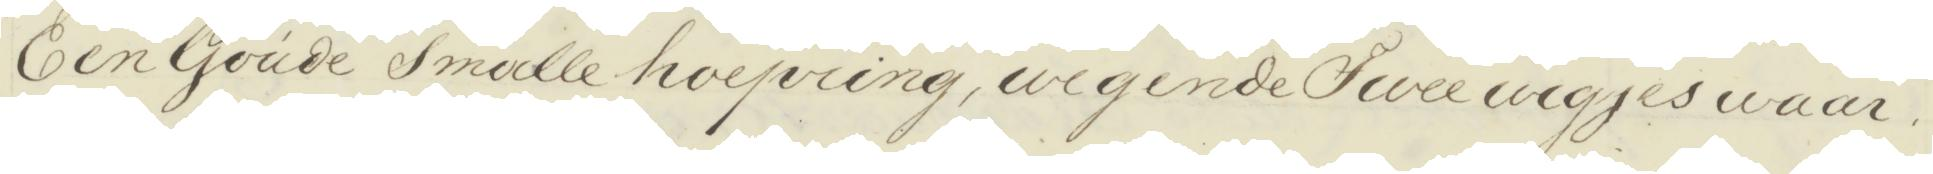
Een Goude Smalle hoepring, wegende Twee wigjes waar.
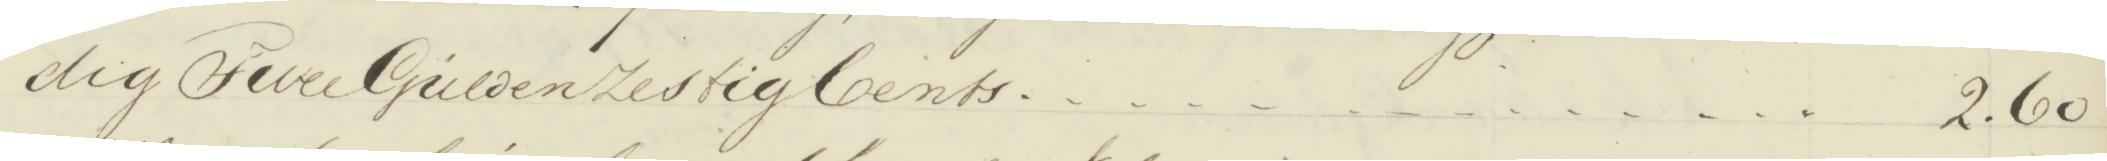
dig Twee Gulden zestig Cents. . . . . . . . . . . . . . . „ 2.60
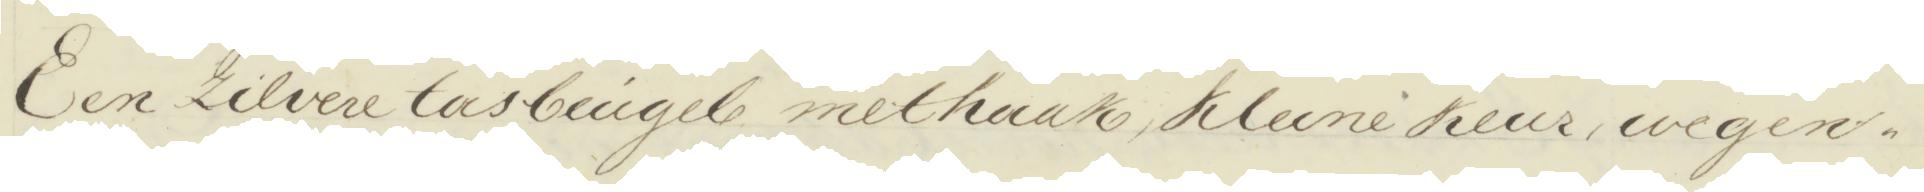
Een zilvere tasbeugel met haak, kleine keur, wegen„
